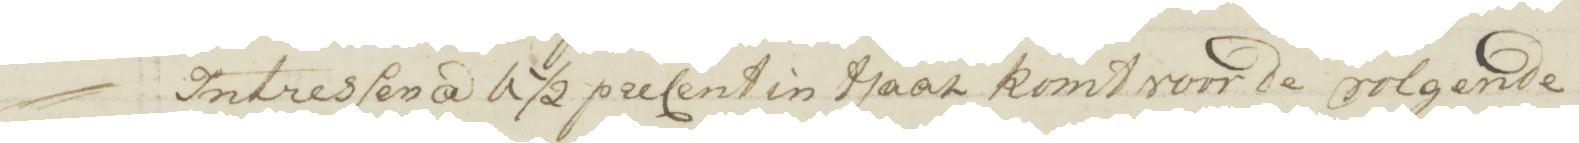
= Intressen @ 4½ precent in tjaar komt voor de volgende
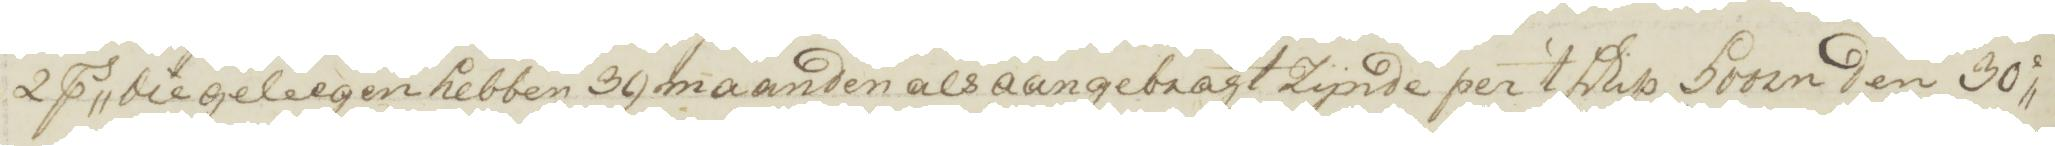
2 p„s die geleegen hebben 39 maanden als aangebragt zijnde per ’t schip hoorn den 30„e
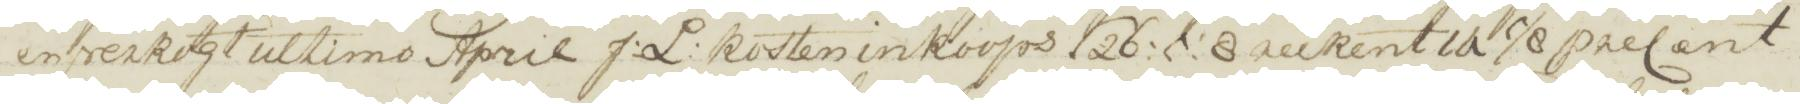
en verkogt ultimo April j: L: Kosten inkoops ƒ26:5:8 reekent 14 5/8 precent
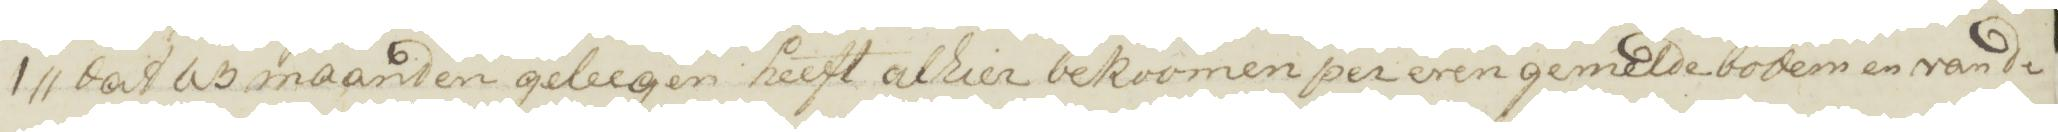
1 „ dat 43 maanden geleegen heeft alhier bekoomen per even gemelde bodem en van de
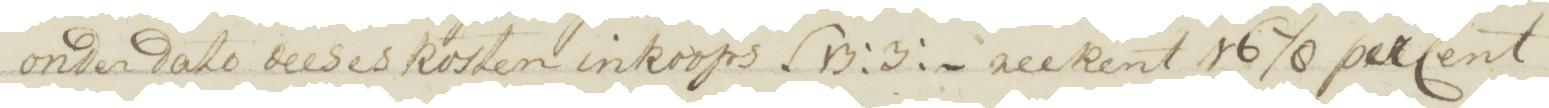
onder dato deeses kosten inkoops ƒ13: 3:— reekent 16 1/8 percent
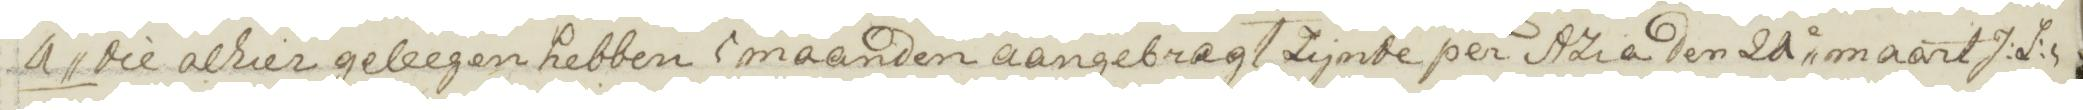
4 „ die alhier geleegen hebben 5 maanden aangebragt zijnde per Azia den 24„e maart J: L: en
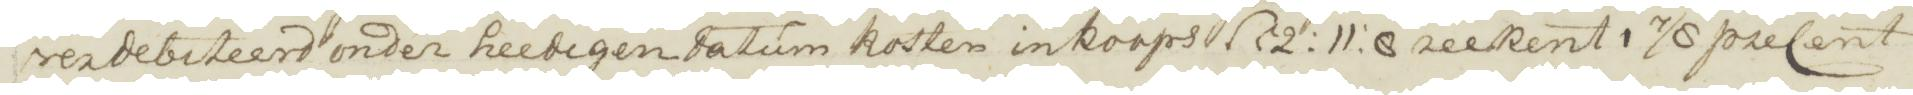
verdebiteerd onder heedigen datum kosten inkoops ƒ52:11:8 reekent 1 7/8 precent
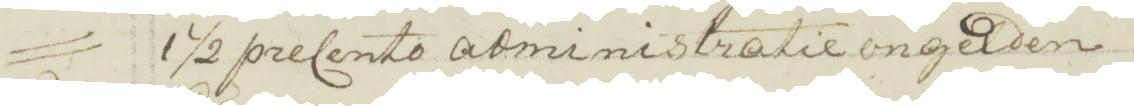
= 1½ precento administratie ongelden
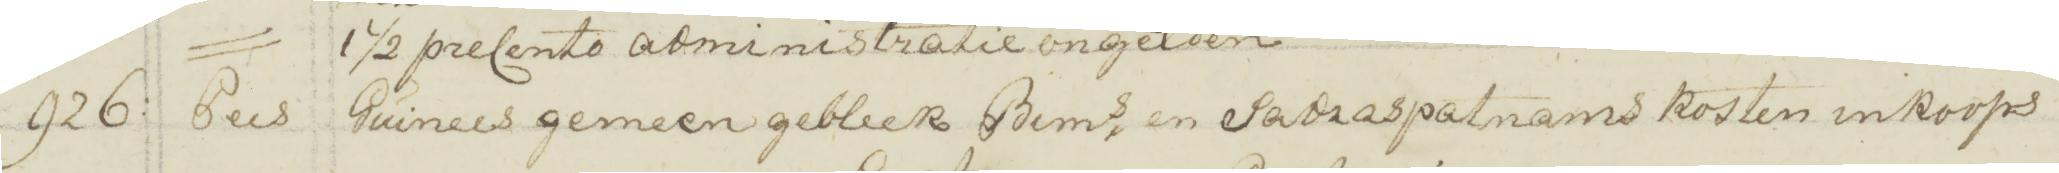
926: Pees Guinees gemeen gebleek Bim„s en Sadraspatnams kosten inkoops
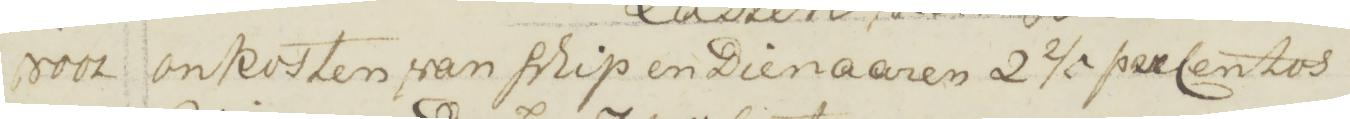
voor onkosten van schip en Dienaaren 2 2/5 percentos
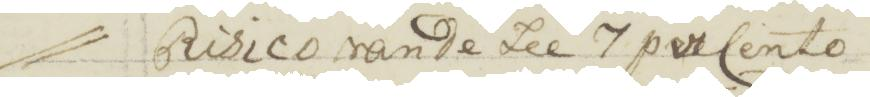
= Risico van de zee 7 percento
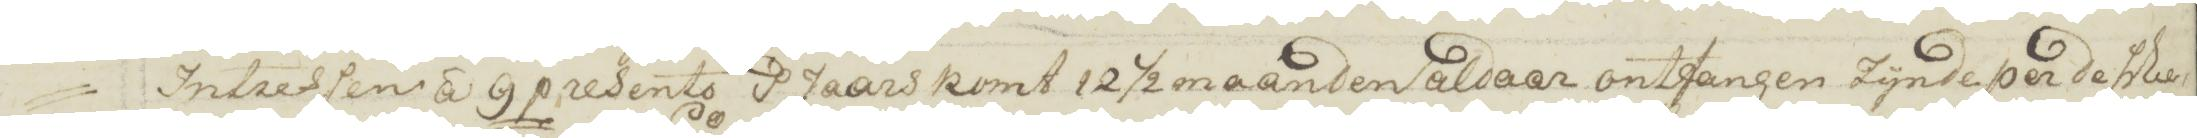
= Intressen @ 9 presento s Jaars komt 12½ maanden aldaar ontfangen zijnde per de schie
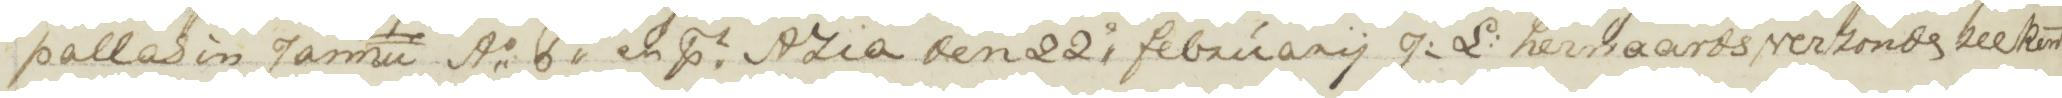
pallas in Jannu A„o P„o en p„r Azia den 22„e februarij J: L: herwaards verzonden reekent
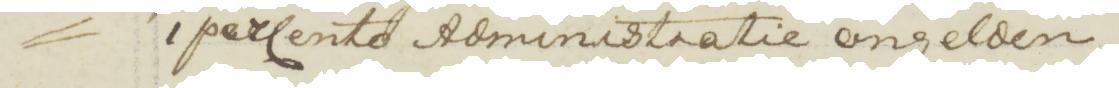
= 1 percento Administratie ongelden
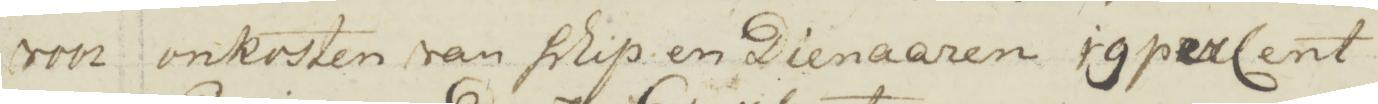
voor onkosten van schip en Dienaaren 19 percent
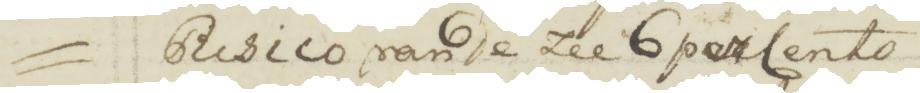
= Risico van de zee 6 percento
